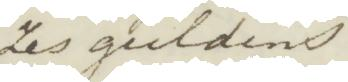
zes guldens
